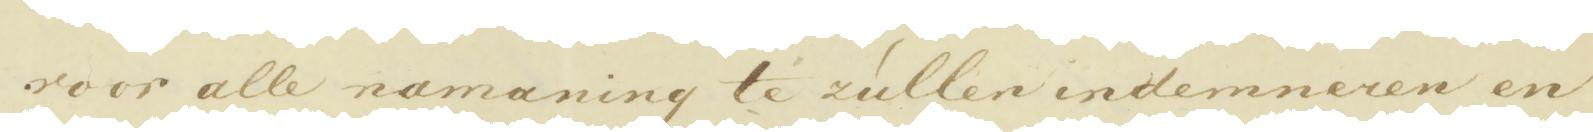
voor alle namaning te zullen indemneren en
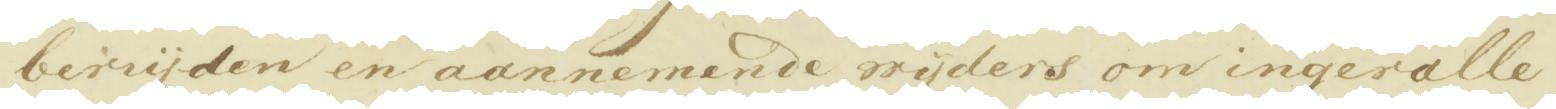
bevrijden en aannemende wijders om ingevalle
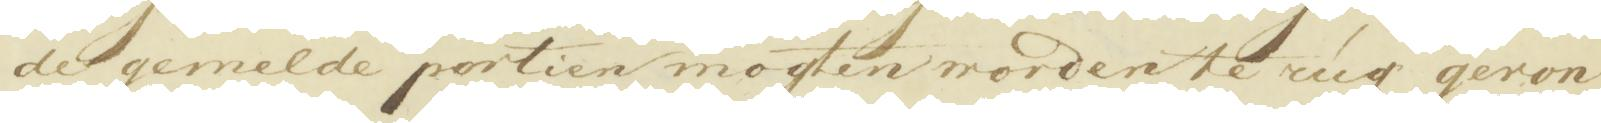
de gemelde portien mogten worden te rug gevon
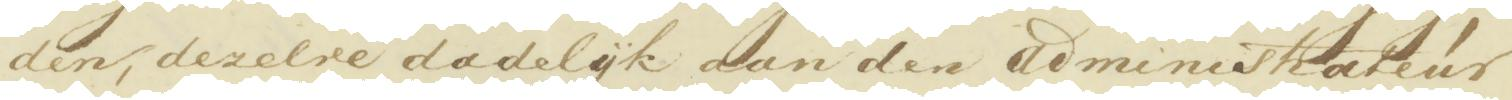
den, dezelve dadelijk aan den administrateur
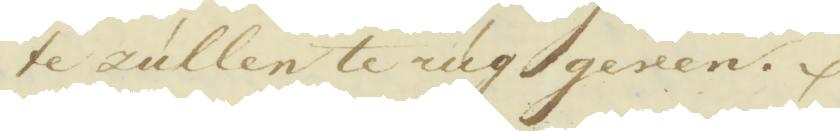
te zullen te ruggeven.
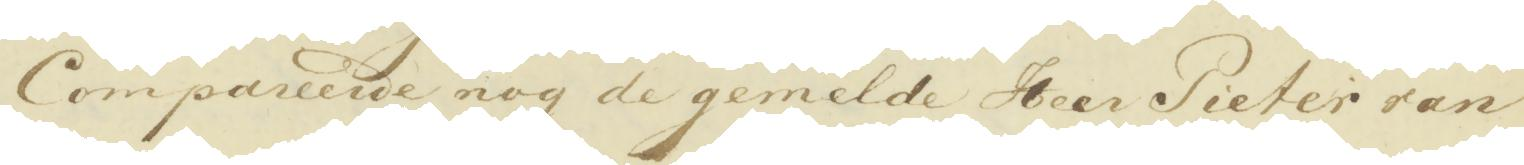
Compareerde nog de gemelde Heer Pieter van
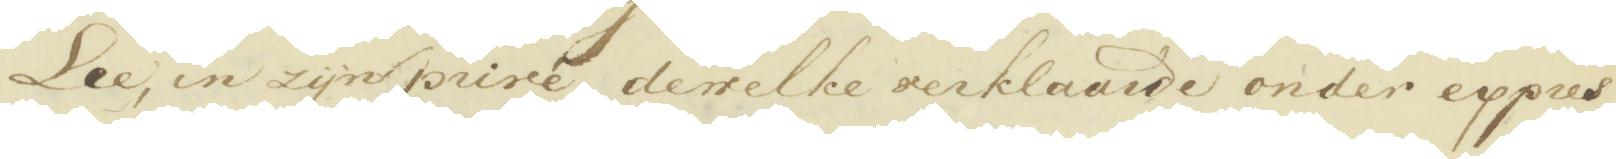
Lee, in zijn privé, dewelke verklaarde onder expres
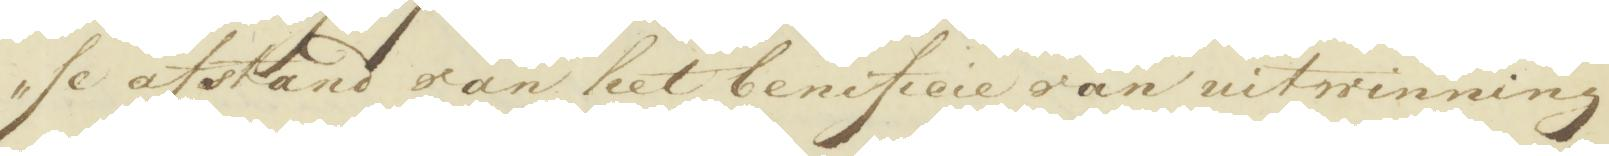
„se afstand van het benificie van uitwinning
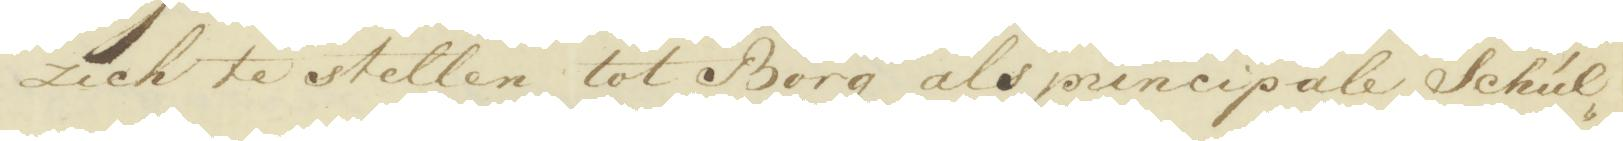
zich te stellen tot Borg als principale Schul„
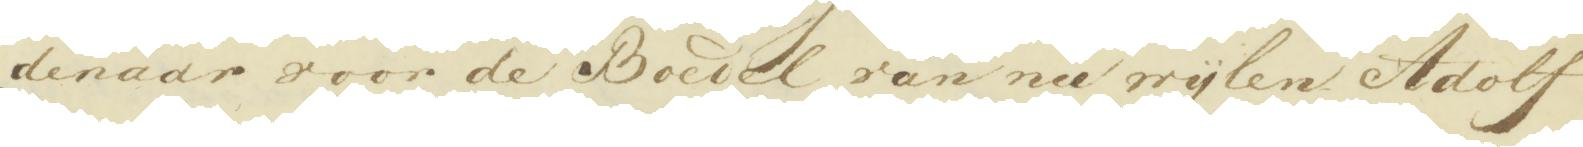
denaar voor de Boedel van nu wijlen Adolf
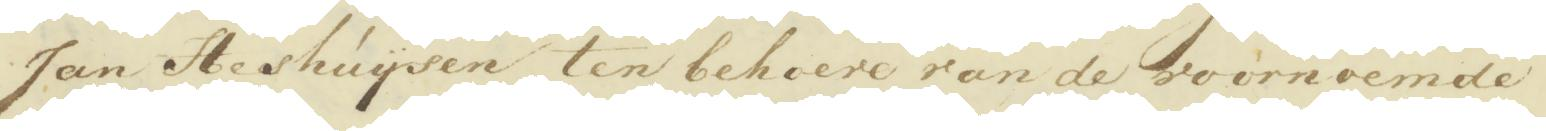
Jan Heshuijsen, ten behoeve van de voornoemde
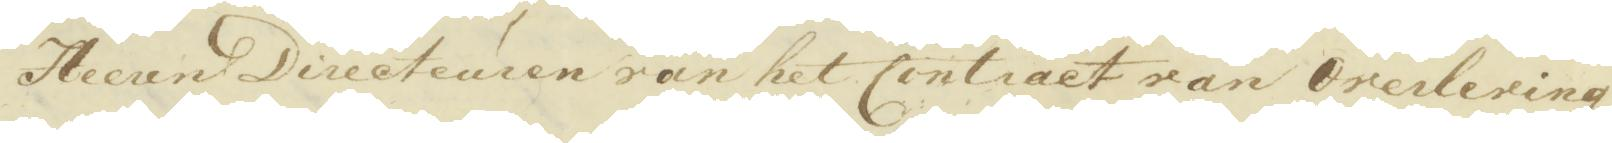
Heeren Directeuren van het Contract van Overleving,
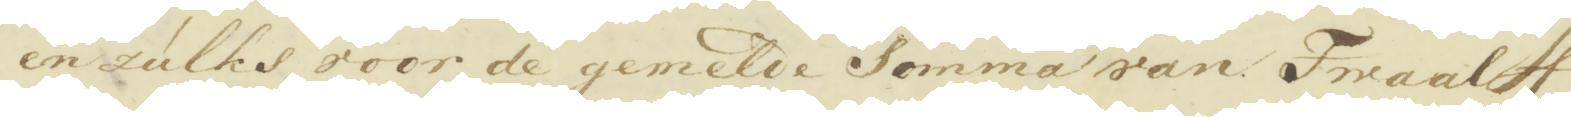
en zulks voor de gemelde somma van Twaalf
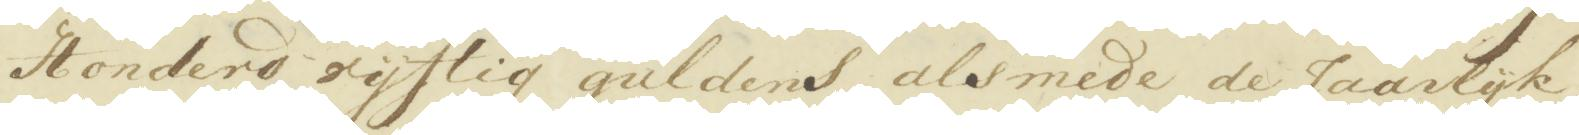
Honderd vijftig guldens, als mede de Jaarlijk
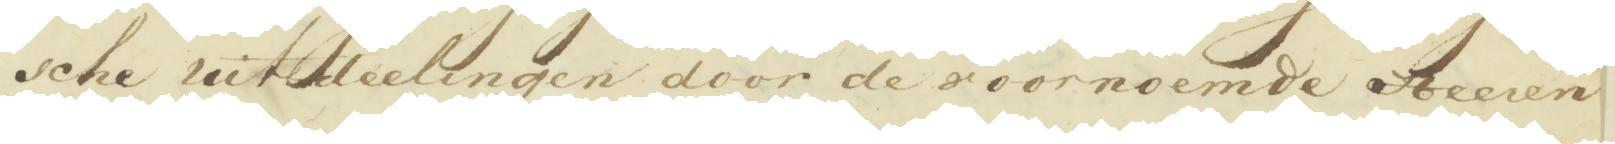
sche uit deelingen door de voornoemde Heeren
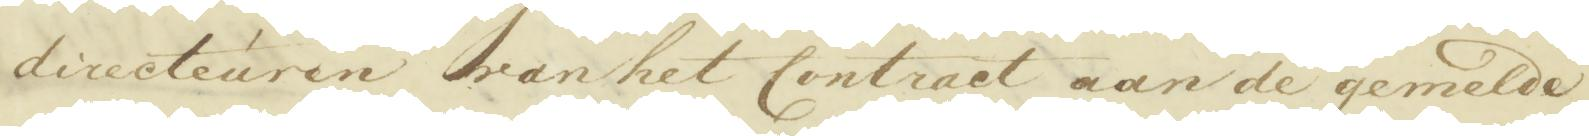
directeuren van het Contract aan de gemelde
